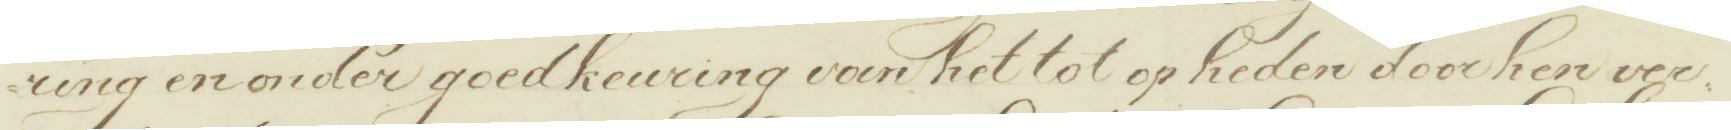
=ring en onder goedkeuring van het tot op heden door hen ver„
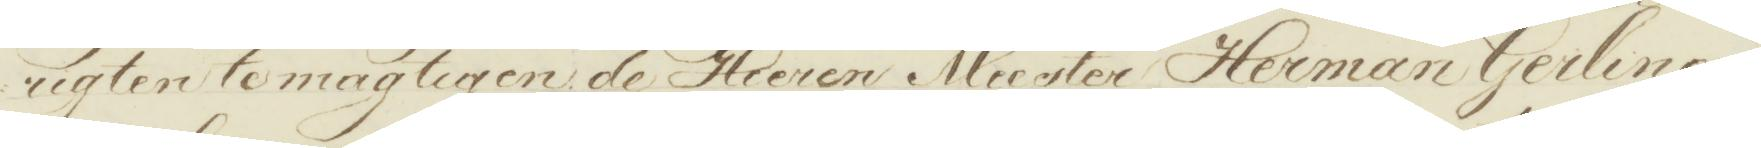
rigten te magtigen de Heeren Meester Herman Gerlings
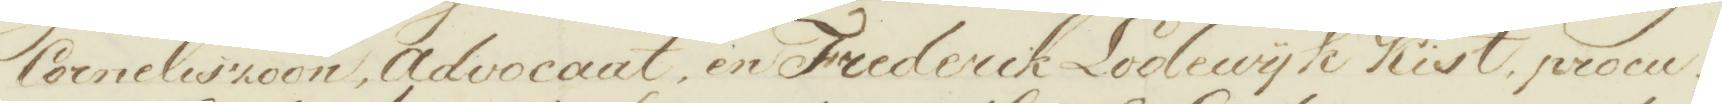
Corneliszoon, Advocaat, en Frederik Lodewijk Kist, procu„
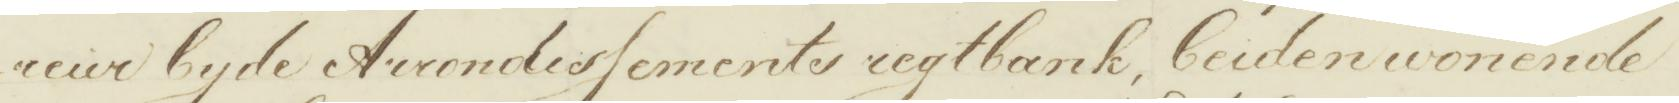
reur by de Arrondissements regtbank, beiden wonende
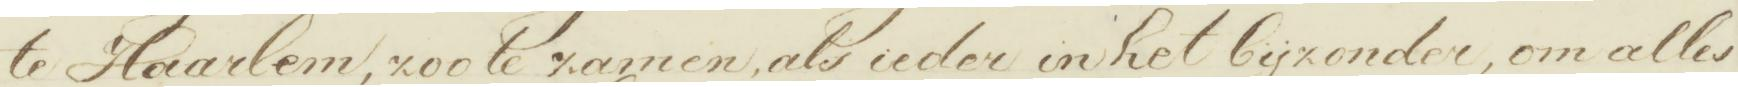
te Haarlem, zoo te zamen, als ieder in het bijzonder, om alles
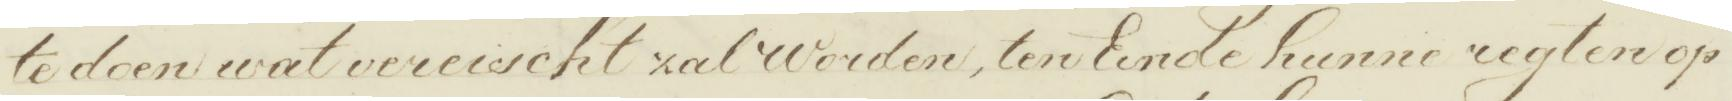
te doen wat vereischt zal worden, ten Einde hunne regten op
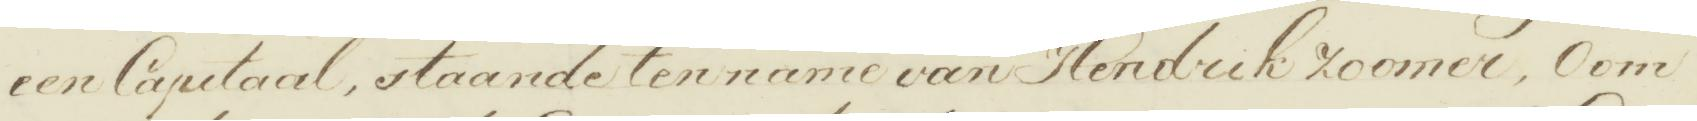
een Capitaal, staande ten name van Hendrik Zoomer, Oom
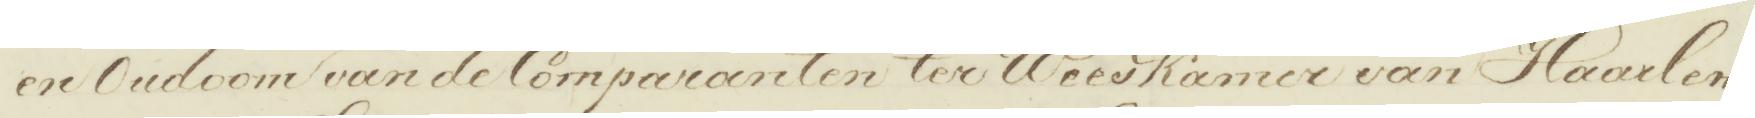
en Oudoom van de Comparanten ter Weeskamer van Haarlem
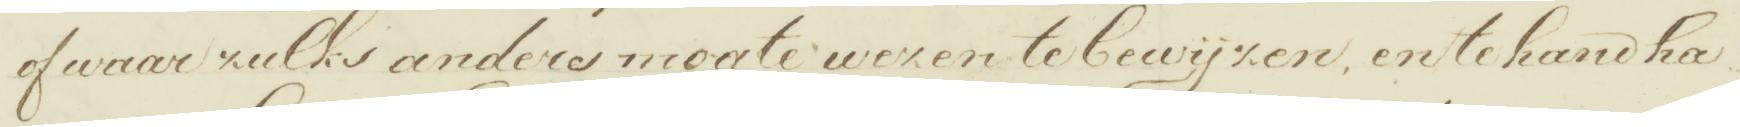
of waar zulks anders mogte wezen te bewijzen, en te handha
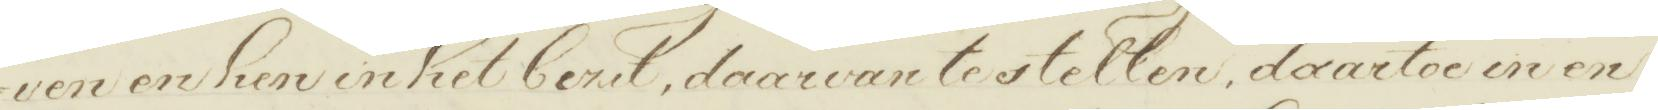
ven en hen in het bezit, daarvan te stellen, daartoe in en
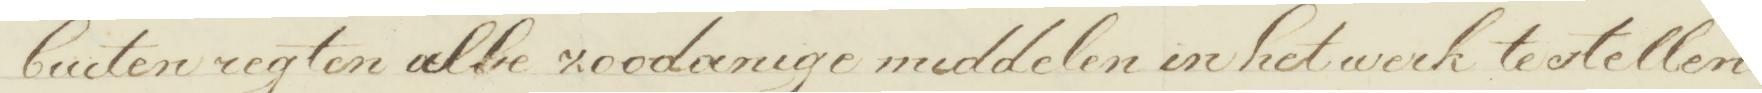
buiten regten alle zoodanige middelen in het werk te stellen
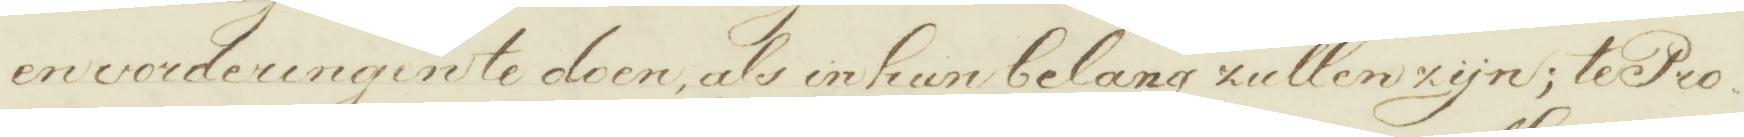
en vorderingen te doen, als in hun belang zullen zijn; te Pro
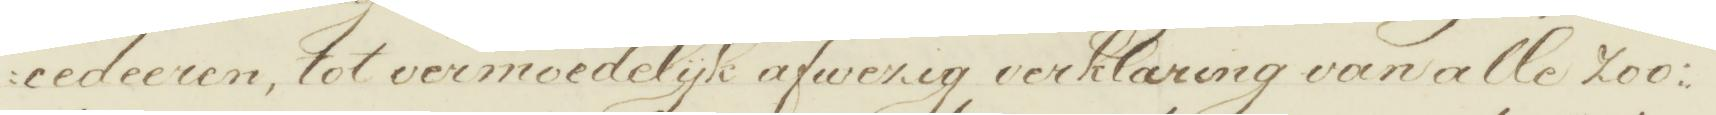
=cedeeren, tot vermoedelijk afwezig verklaring van alle zoo:
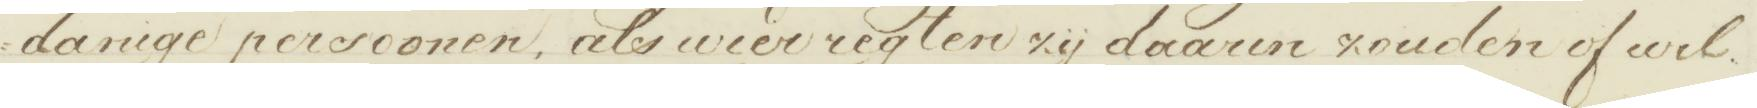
danige persoonen, als wier regten zij daarin zouden of wil„
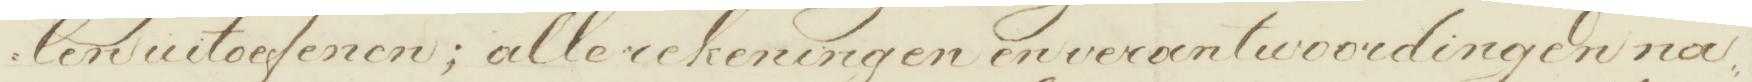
=len uitoefenen; alle rekeningen en verantwoording en na„
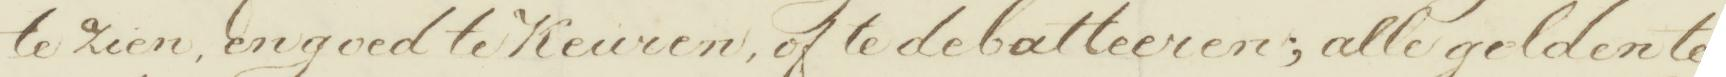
te zien, en goed te keuren, of te debatteeren, alle gelden te
